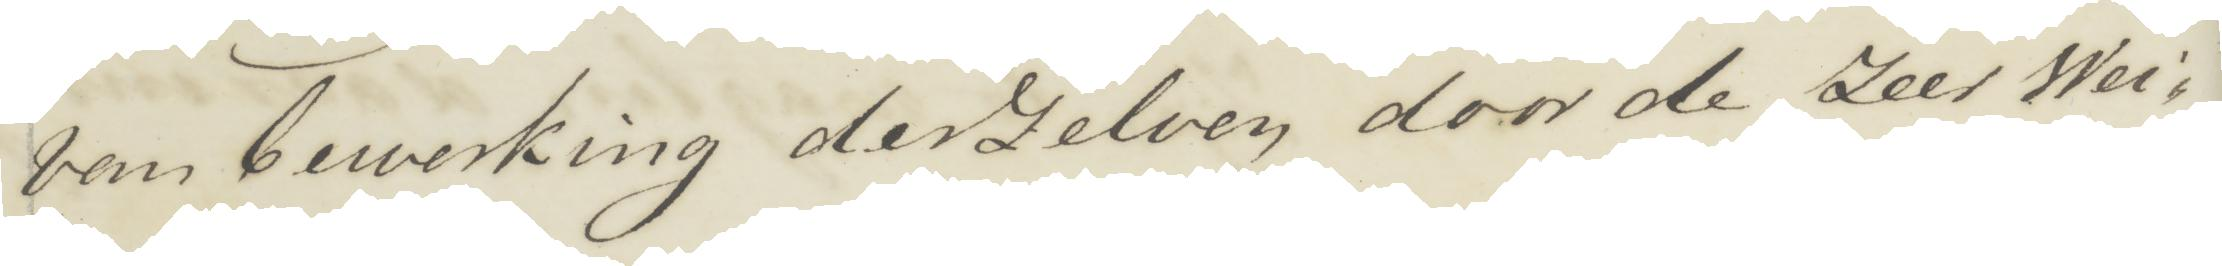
van bewerking derzelven door de zeer wei„
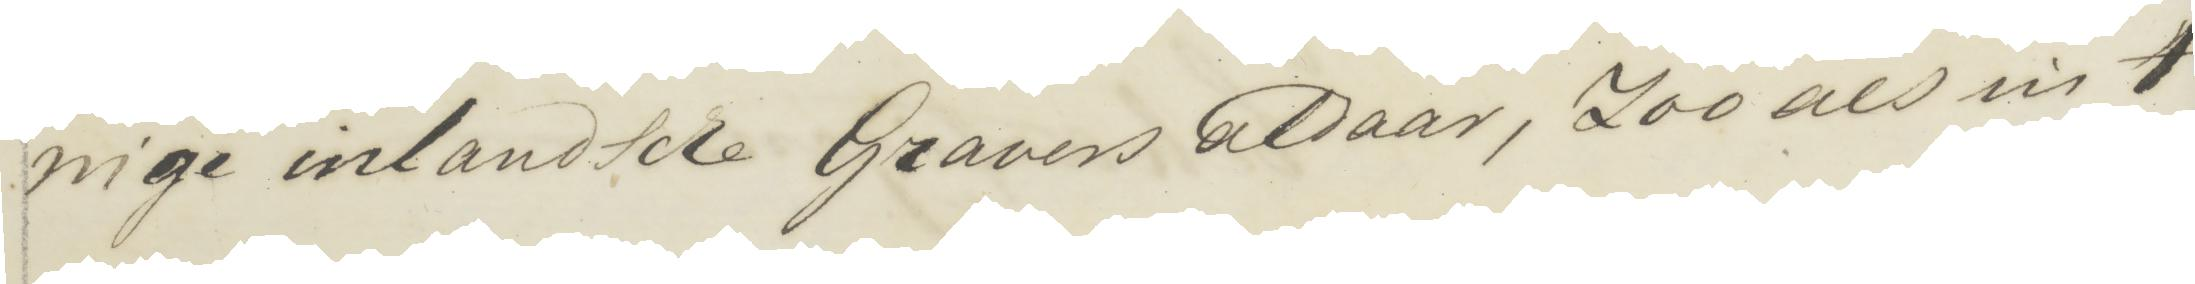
nige inlandsche Gravers aldaar, zoo als in 't
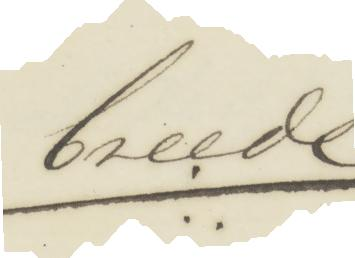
breede
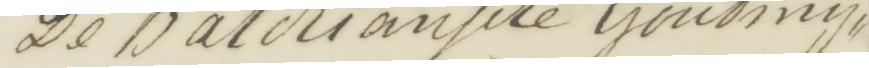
De Batchiansche Goudmij„
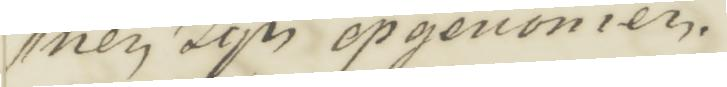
„nen zyn opgenomen.
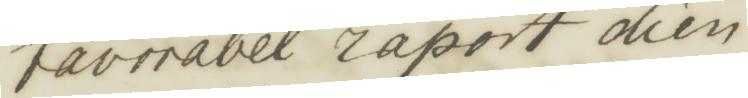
favorabel raport dien
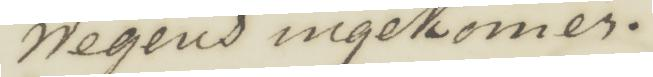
wegens ingekomen.
